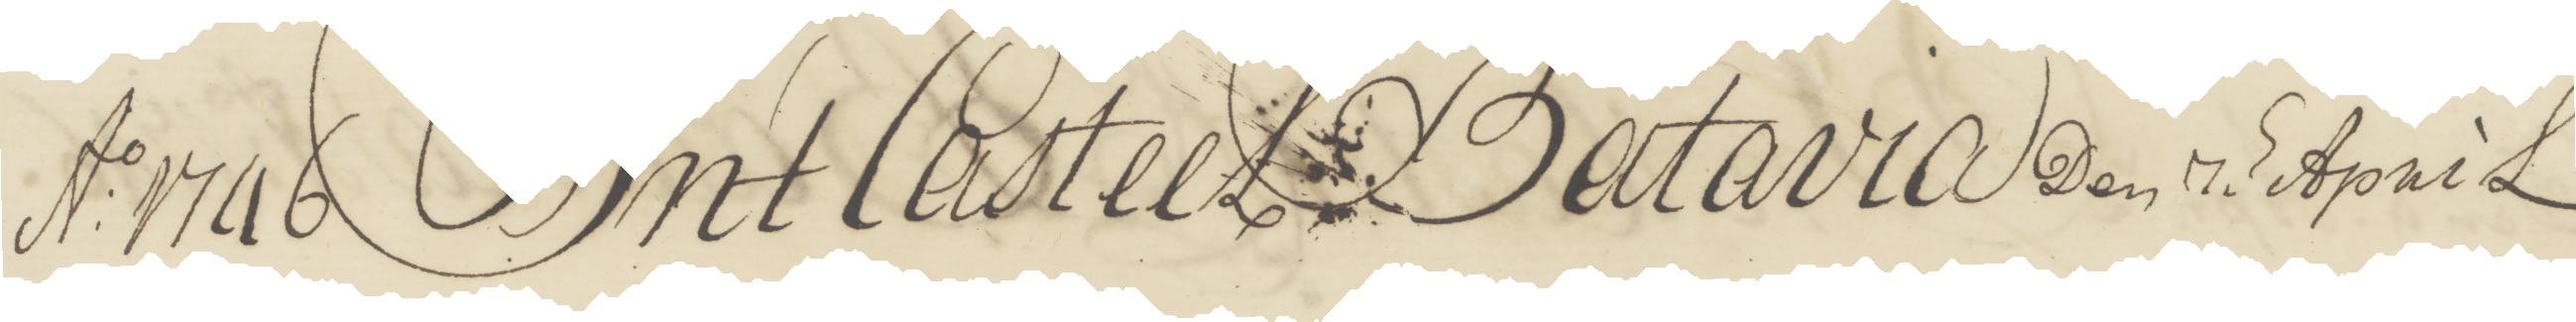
A:o 1746 In 't Casteel Batavia Den 7'en April
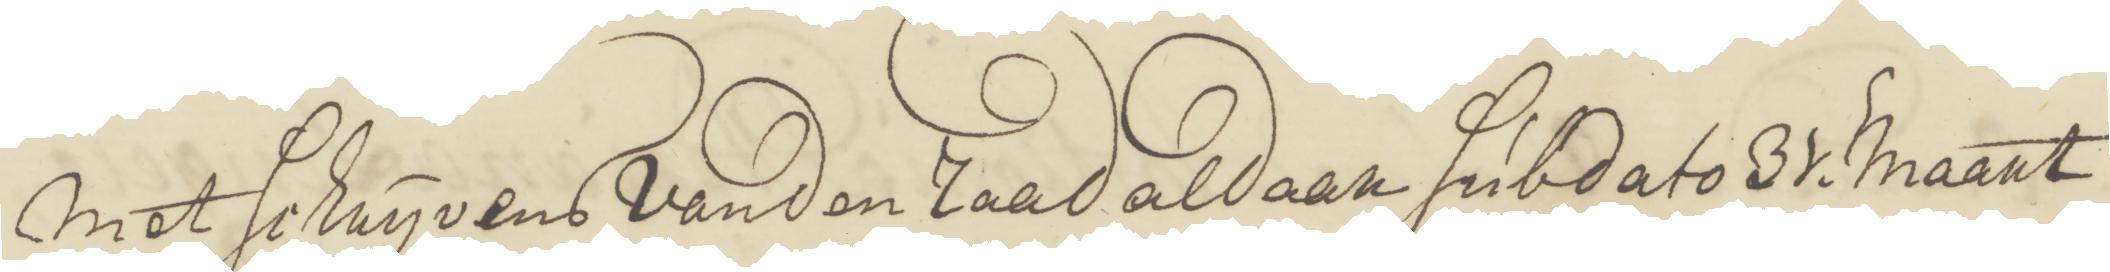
met schrijvens van den raad aldaar sub dato 31.' Maart
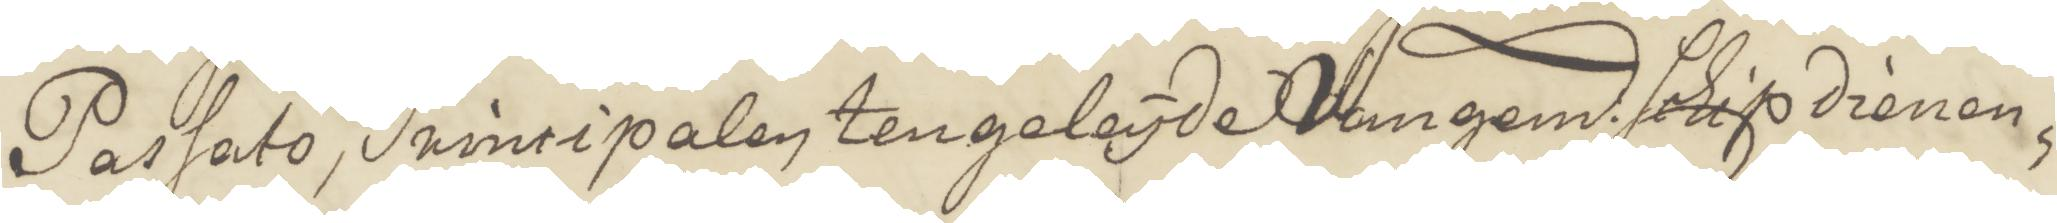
Passato, Principalen ten geleijde van gem. schip dienen„
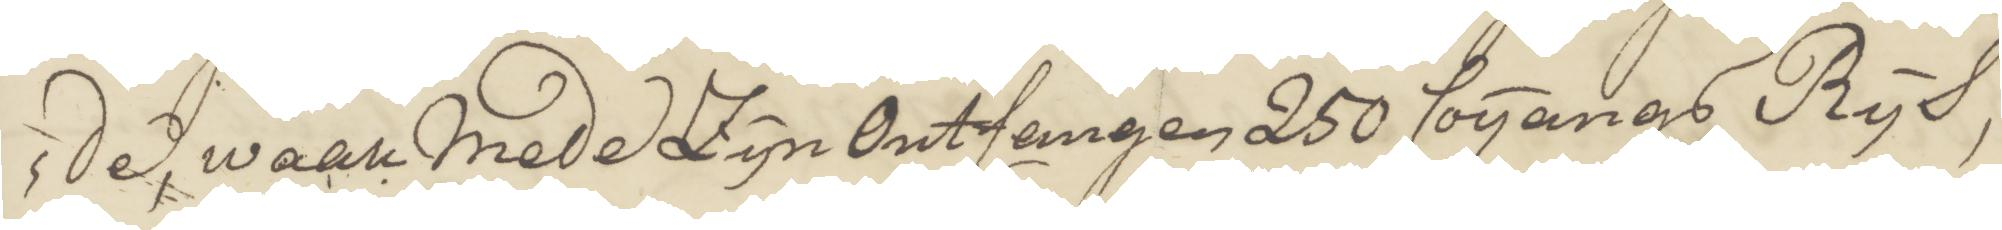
„de, waar mede Zijn ontfangen 250 Coijangs Rijs,
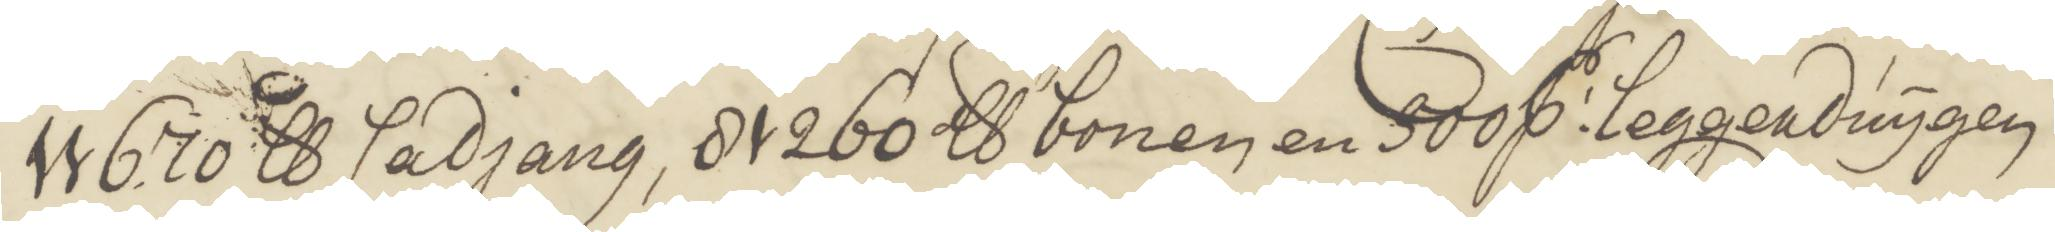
116.70 lb Cadjang, 81260 lb bonen en 300 p:s leggerduijgen
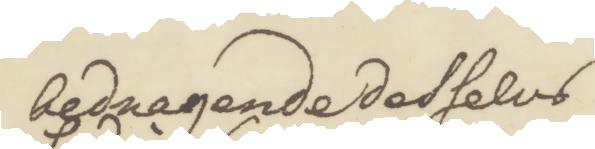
bedragende desselve
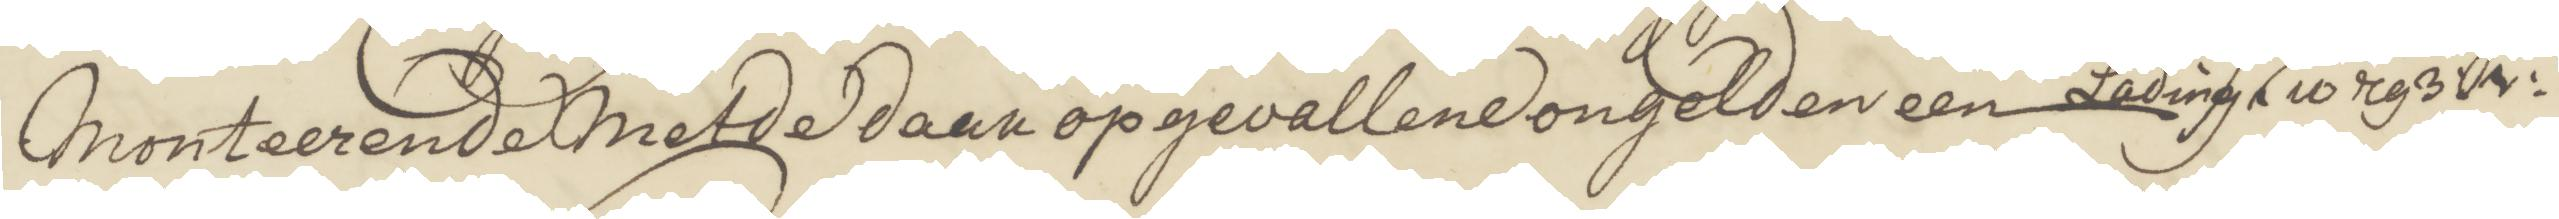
Monteerende Met de daar op gevallene ongelden een Lading ƒ 10 793:1:
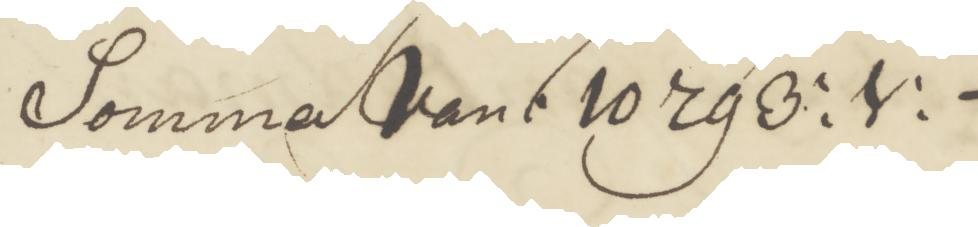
Somma van ƒ 10 793:1:
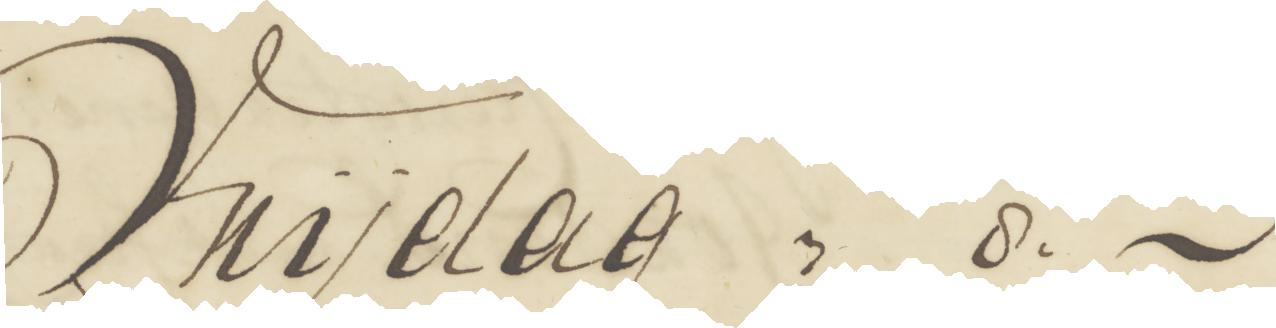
Vrijdag „ 8.' d;o
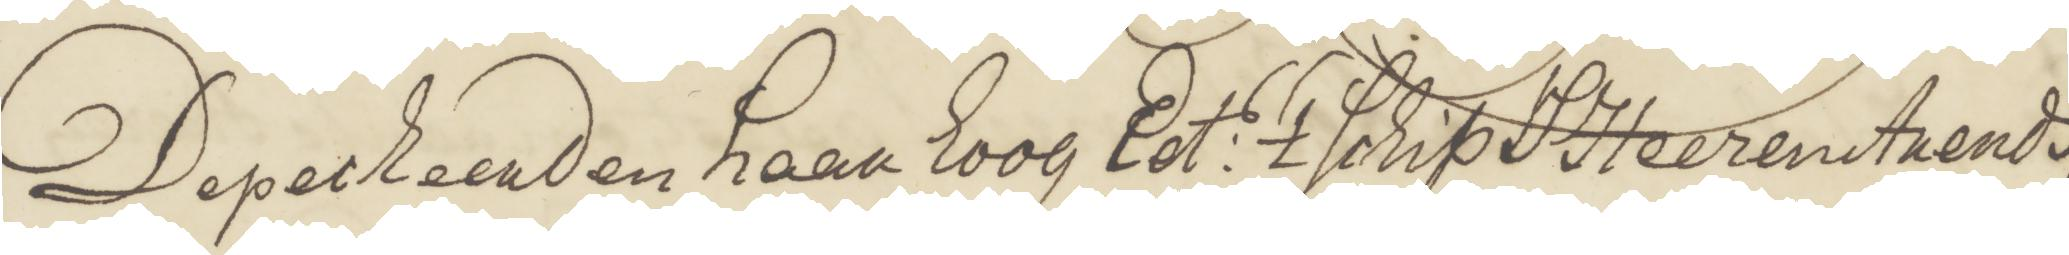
Depecheerden haar hoog Ed:s 't Schip 'S Heeren Arend
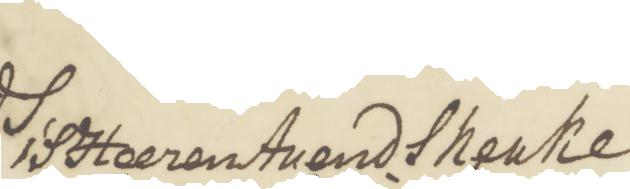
's Heeren Arendskerke
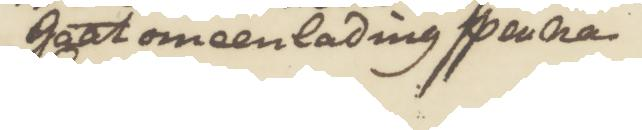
gaat om een lading pper na
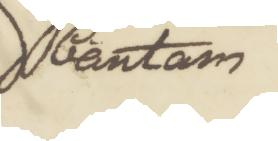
bantam
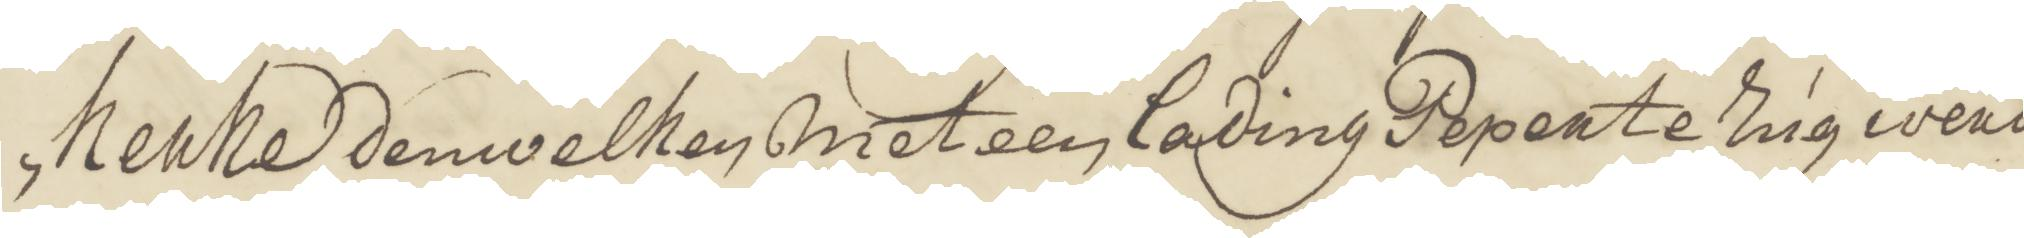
„kerke den welken met een lading Peper terug werd
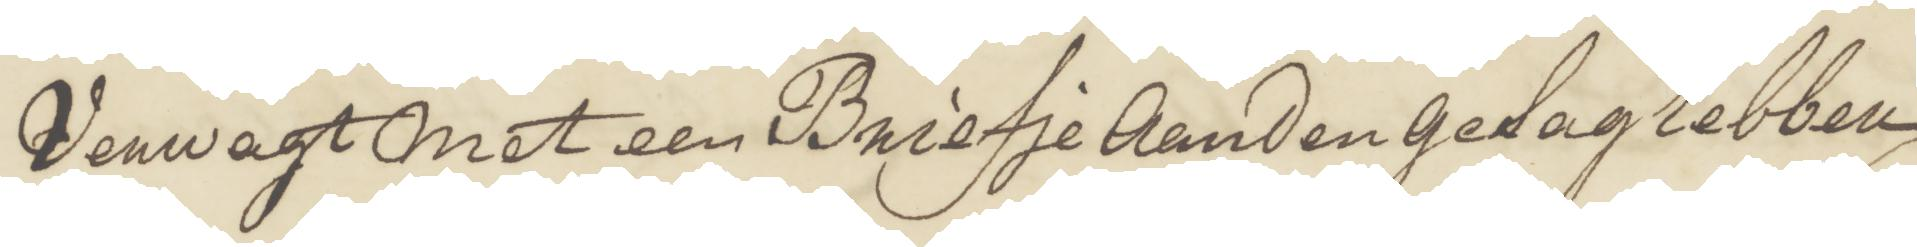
verwagt met een Briefje Aan den gesaghebber
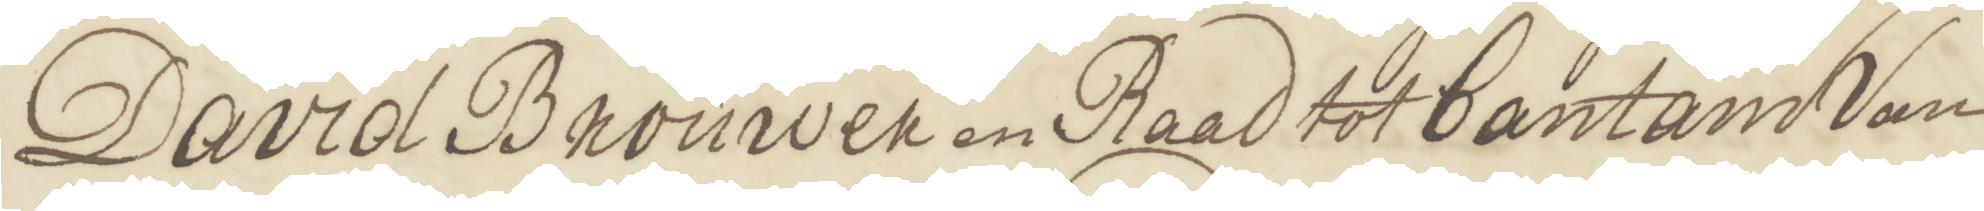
David Brouwer en Raad tot bantam Van
